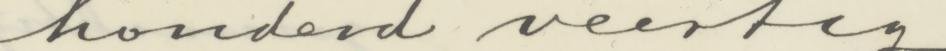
honderd veertig
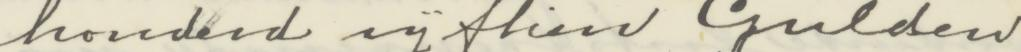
honderd vijftien Gulden
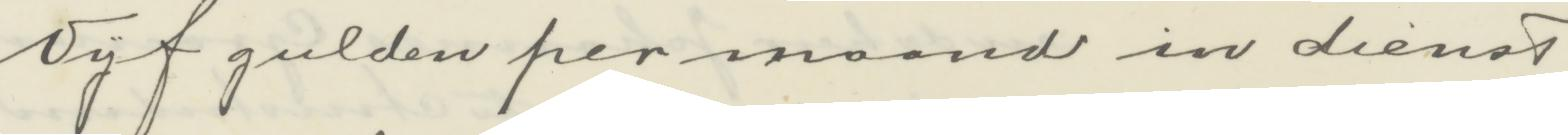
Vijf gulden per maand in dienst
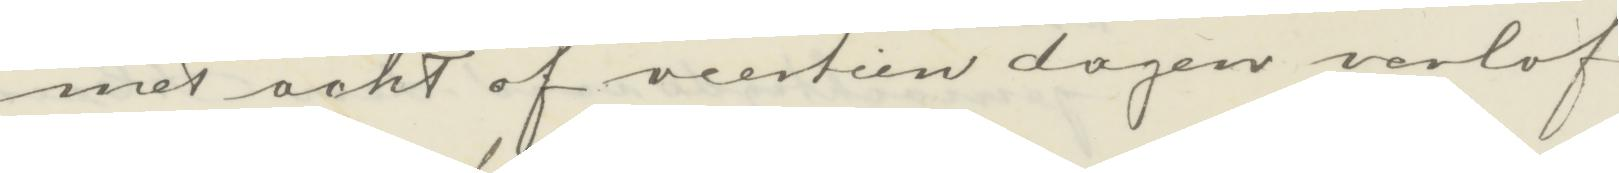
met acht of veertien dagen verlof
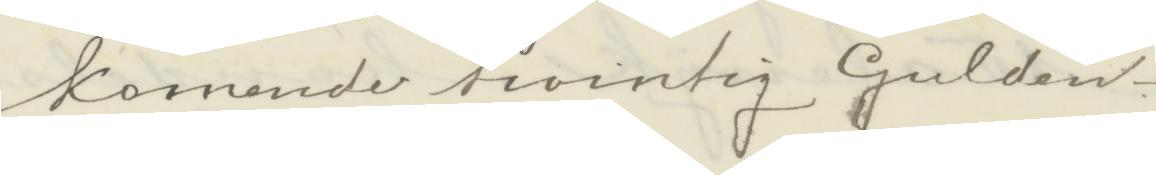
komende twintig Gulden
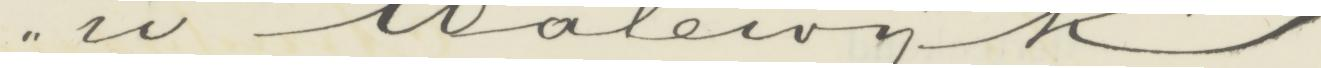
„ri Walewijk
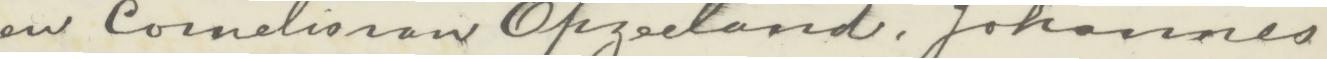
en Cornelis van Opzeeland, Johannes
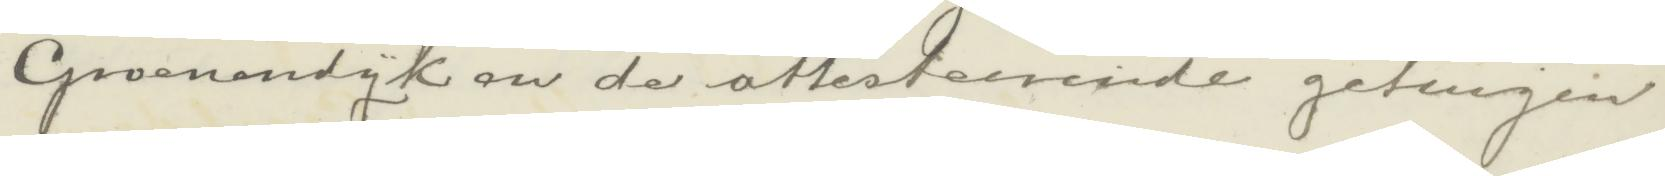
Groenendijk en de attesteerende getuigen
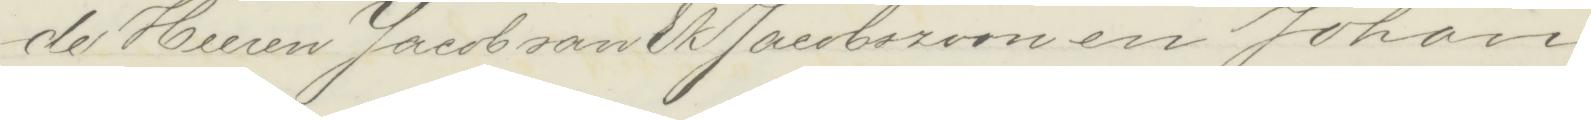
de Heeren Jacob van Ek Jacobszoon en Johan
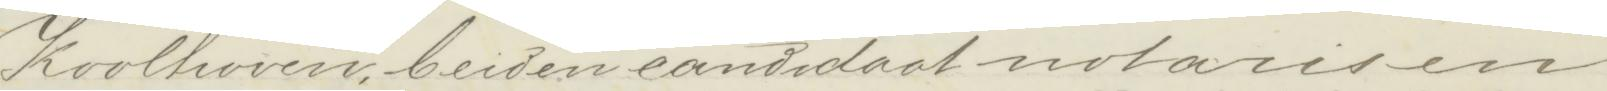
Koolhoven, beiden candidaat notaris en
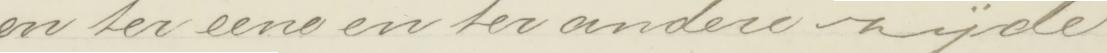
en ter eene en ter andere zijde
